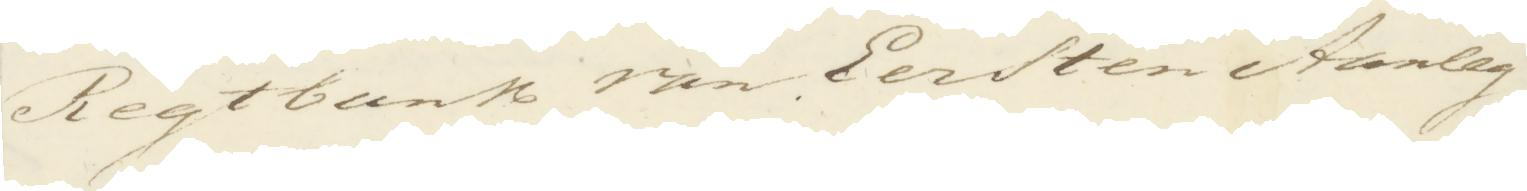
Regtbank van Eersten Aanleg
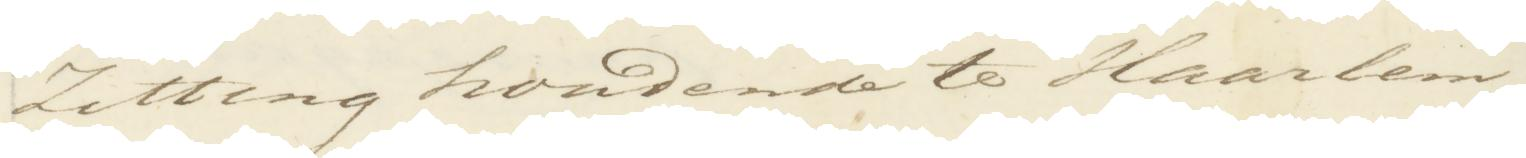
Zitting houdende te Haarlem,
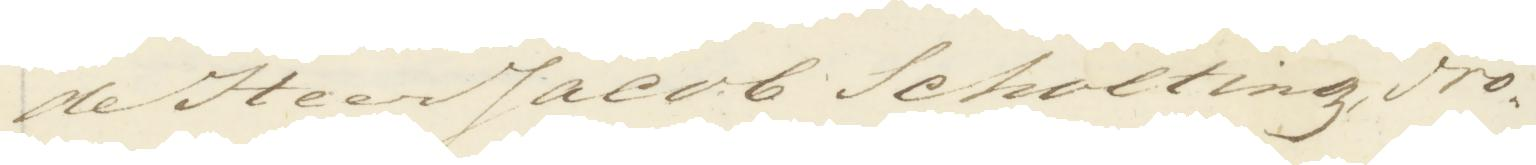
de Heer Jacob Scholting, No„
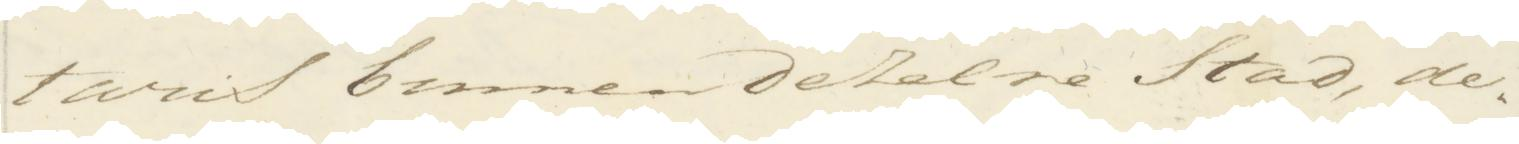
taris binnen dezelve stad, de„
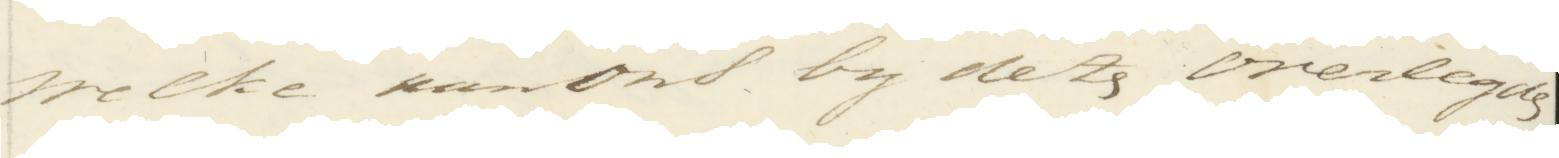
welke aan ons by deze overlegde
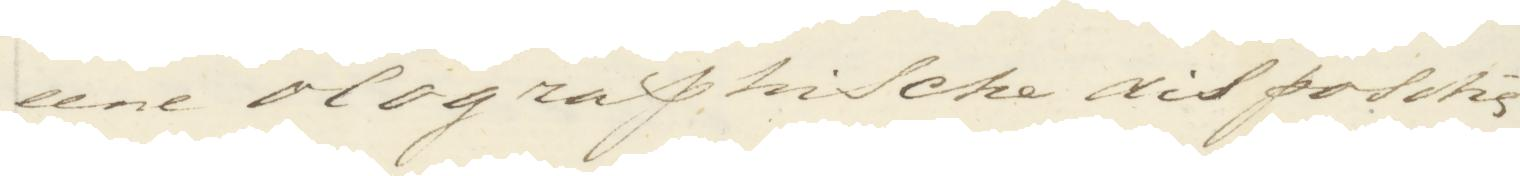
eene olographische dispositie
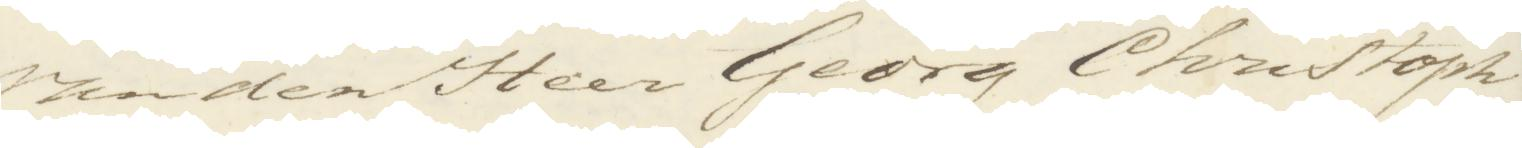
van den Heer Georg Christoph
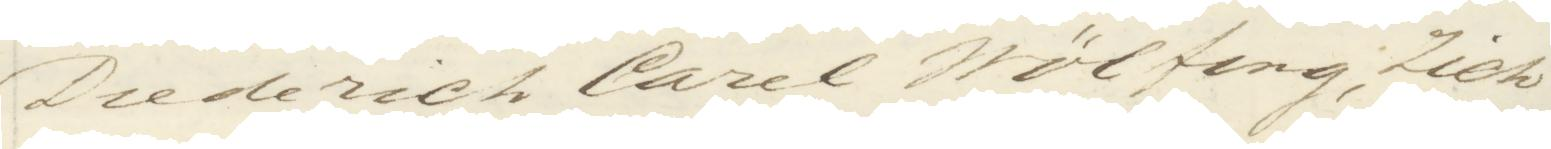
Diederich Carel Wölfing, zich
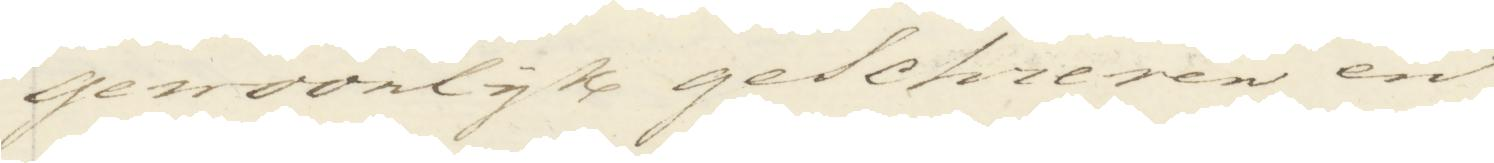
gewoonlijk geschreven en
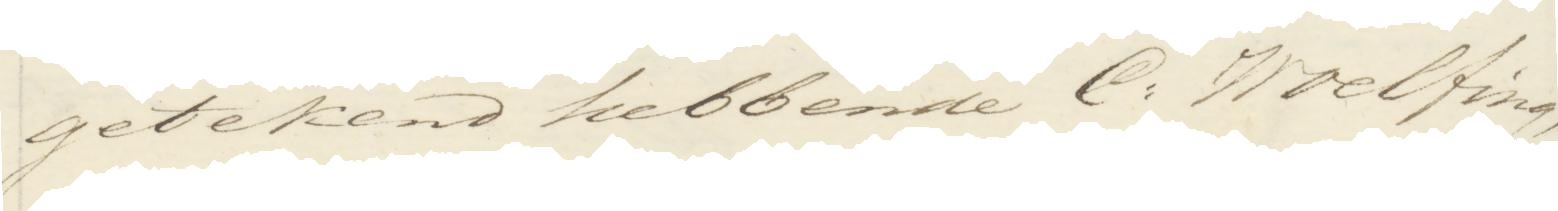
getekend hebbende C: Woelfing,
